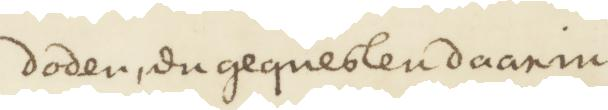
doden, en gequesten daarin
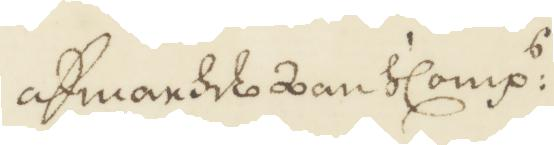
afmarsch van s'Comp:s
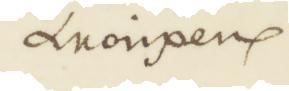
troupen
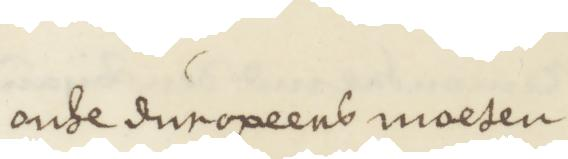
onse europeers moeten
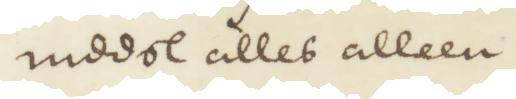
meest alles alleen
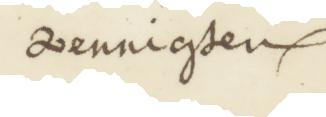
verrigten
